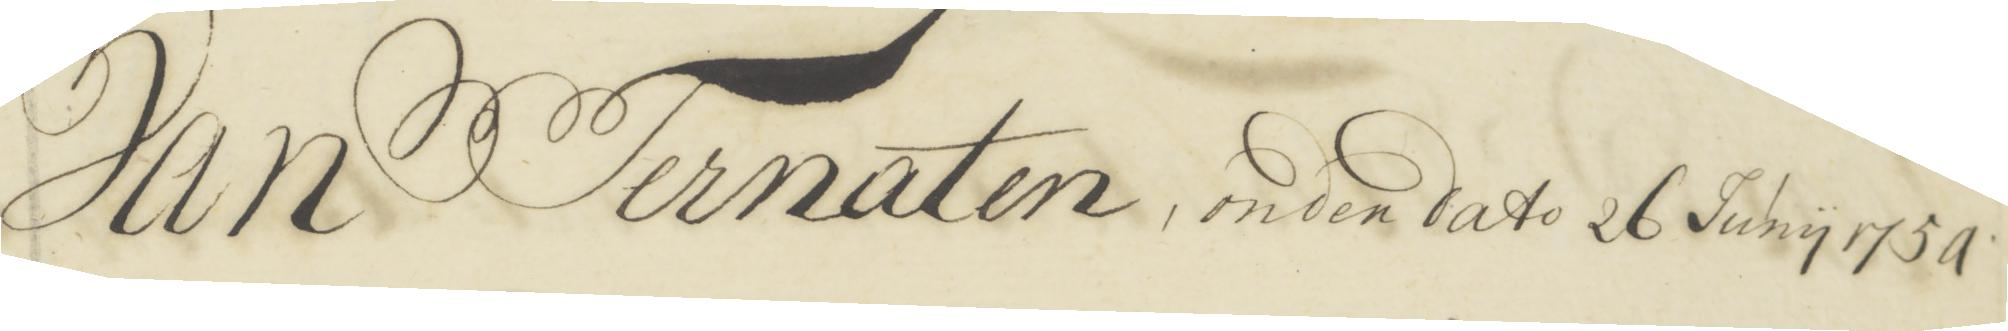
Van Ternaten, onder dato 26 Iunij 1754
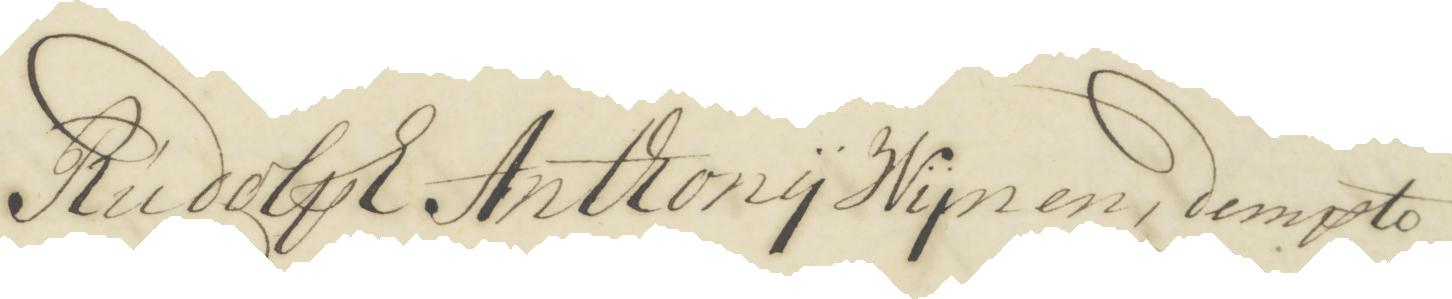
Rudolph Anthonij Wijnen, dempto
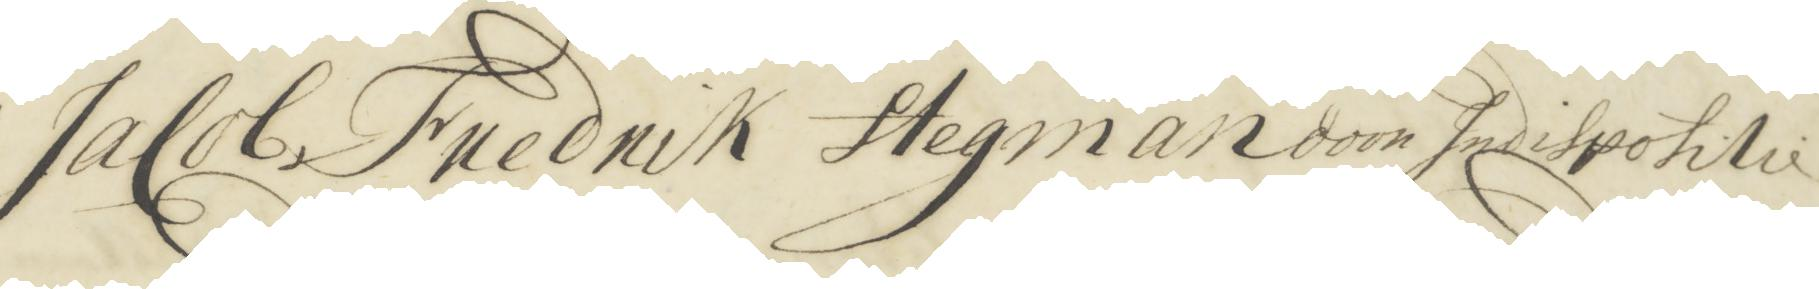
Jacob Fredrik Stegman, door Jndispositie
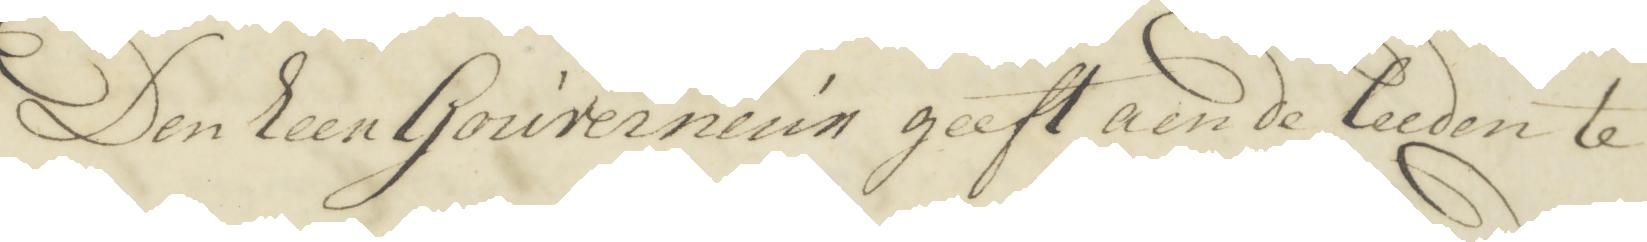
Den heer Gouverneur geeft aen de leeden te
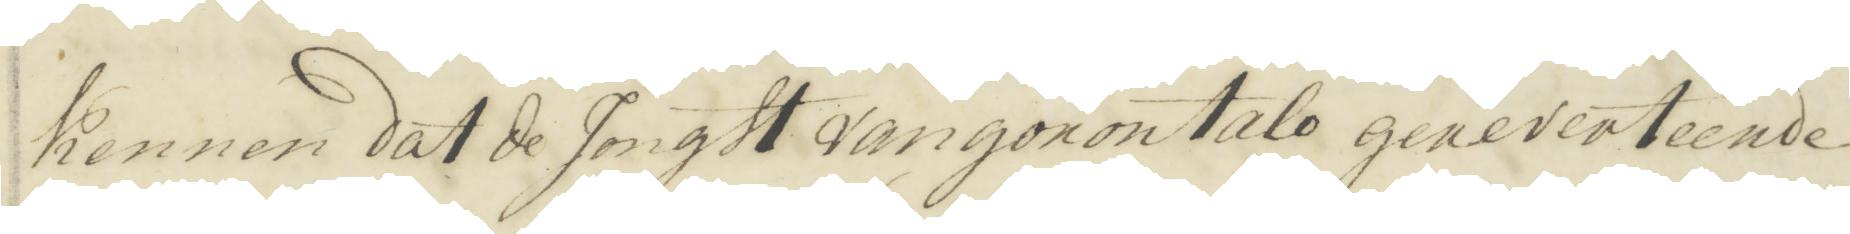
kennen dat de Jongst van gorontalo gereverteerde
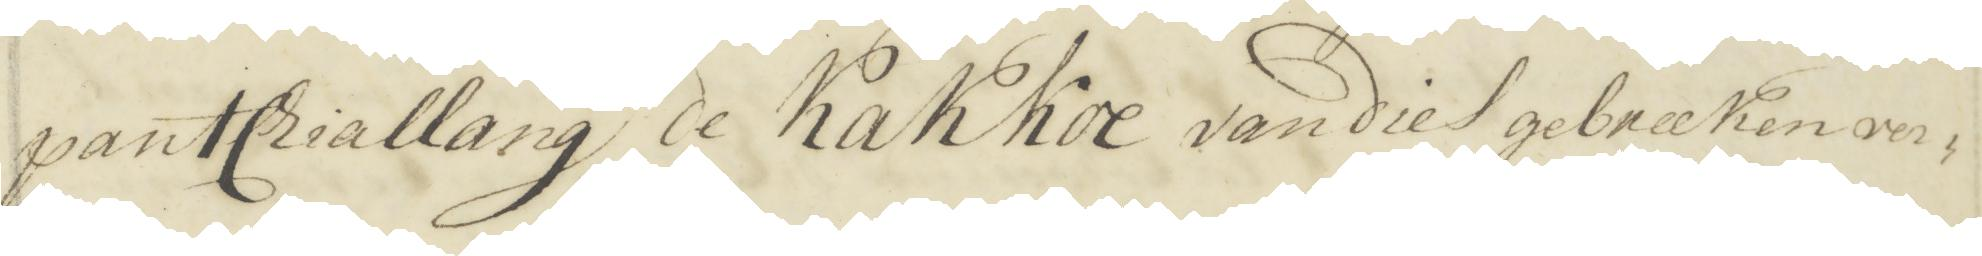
pantchiallang de Kakkoe van dies gebreeken ver„
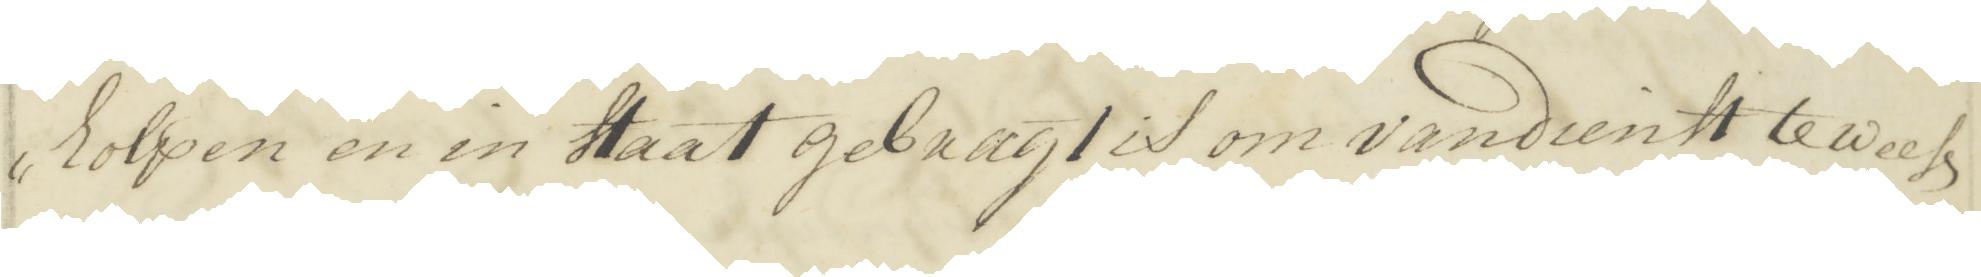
„holpen en in staat gebragt is om van dienst te weesen
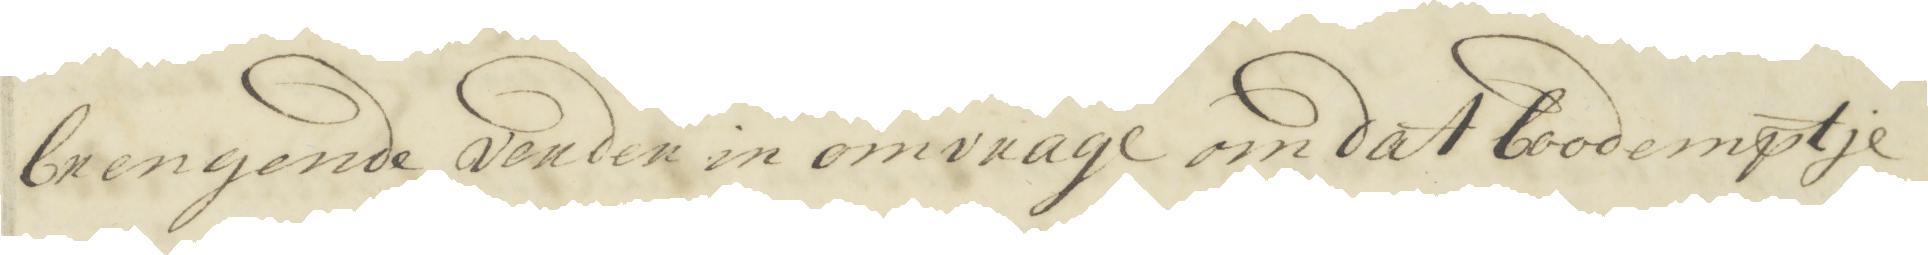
brengende verder in omvrage om dat boodemptje
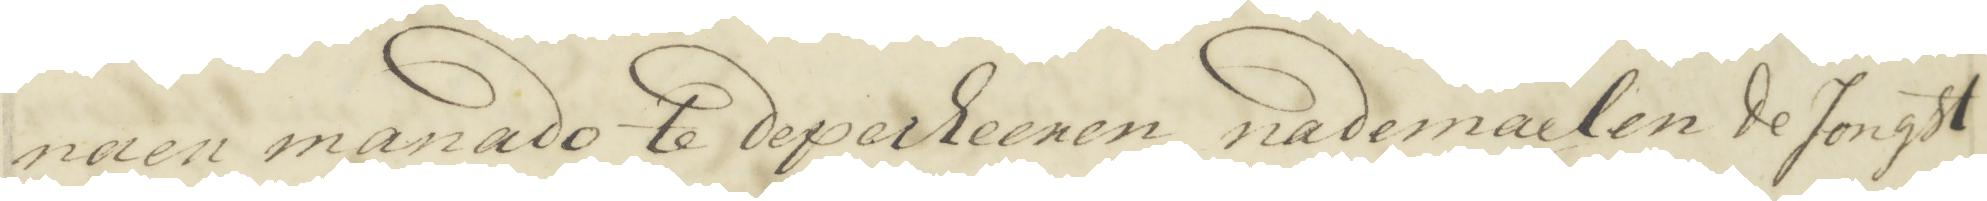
naer manado te depecheeren nademaelen de Jongst
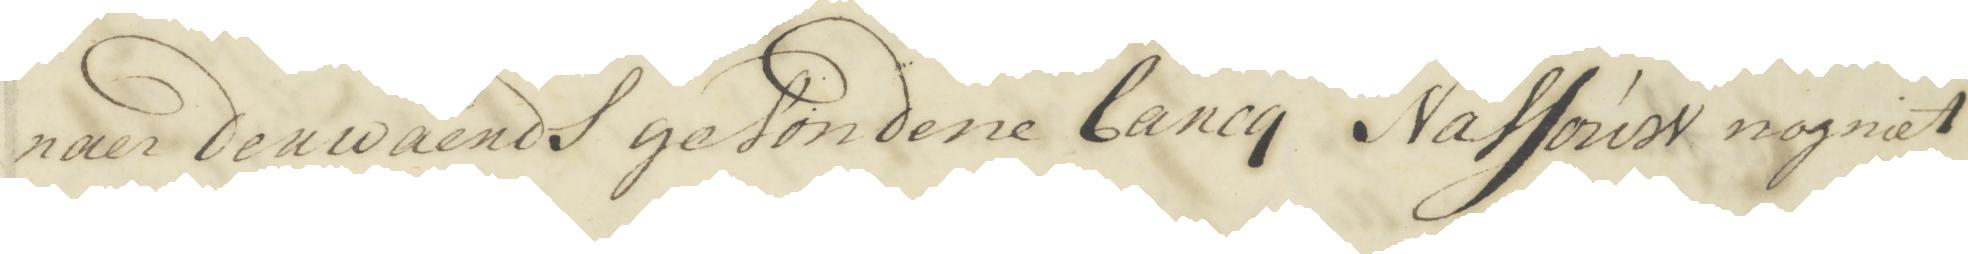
naer derwaerds gesondene barcq Nassouw nog niet
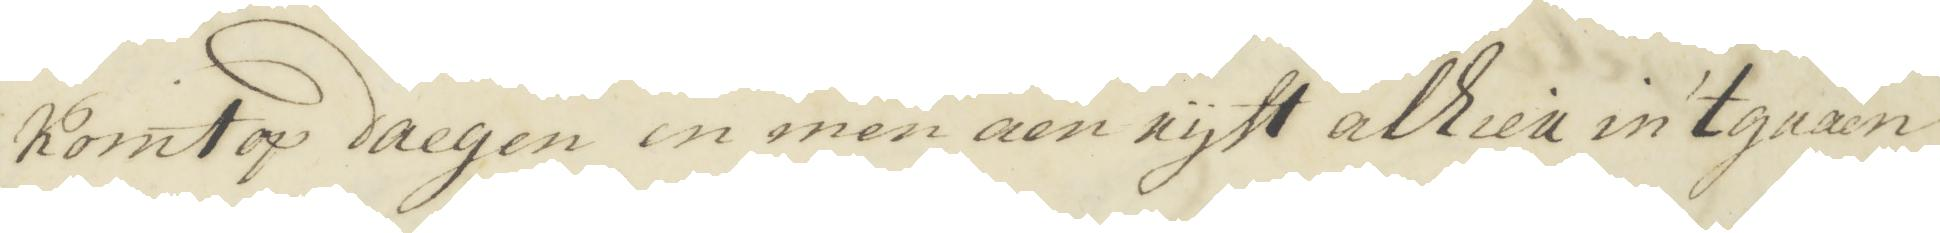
komt op daegen en men aen rijst alhier in 't graen
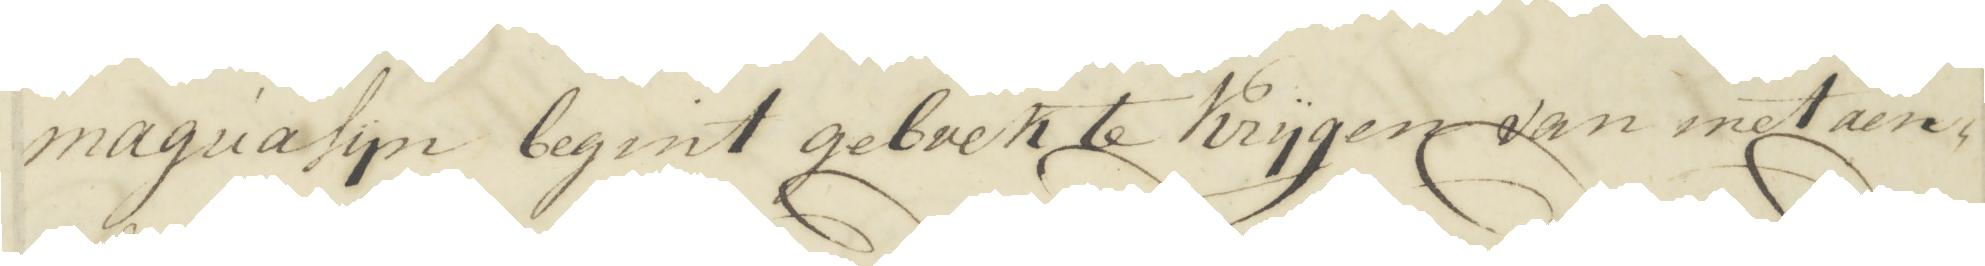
maguasijn begint gebrek te krijgen van met aen„
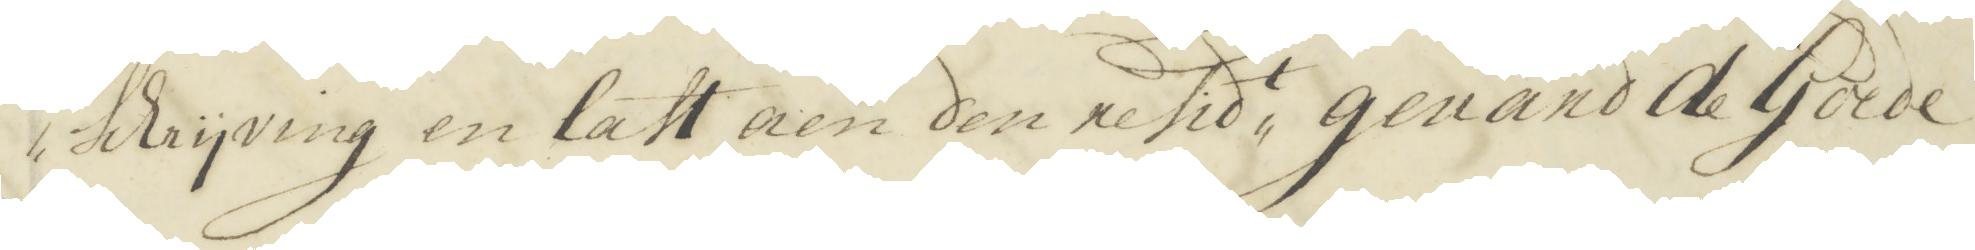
„schrijving en last aen den resid„t gerard de Goede
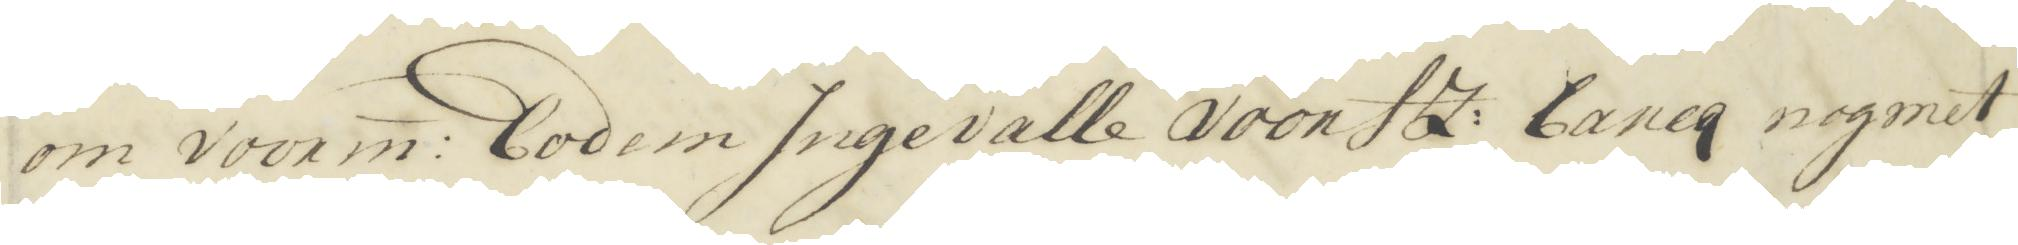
om voorm: bodem Jngevalle voorsz: barcq nog met
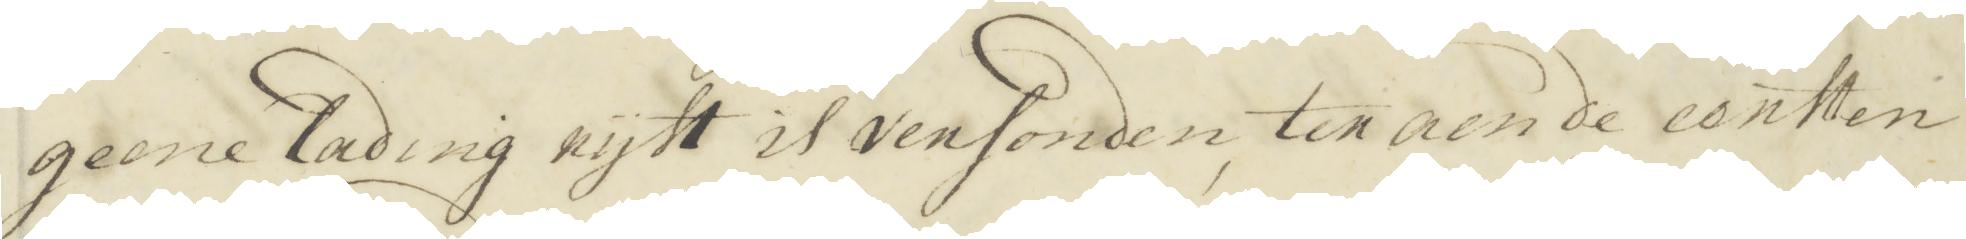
geene lading rijst is versonden, ter aen de eersten
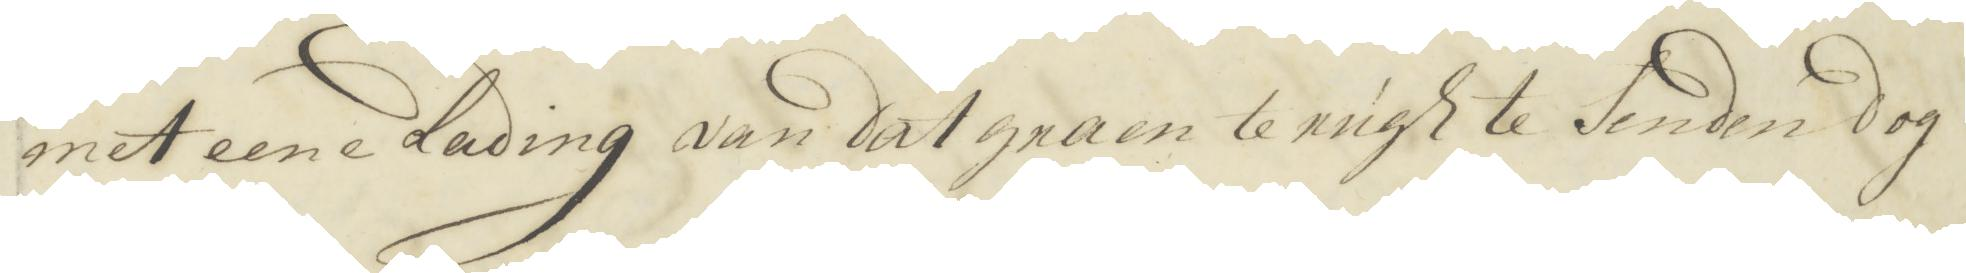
met eene lading van dat graen terugh te senden dog
